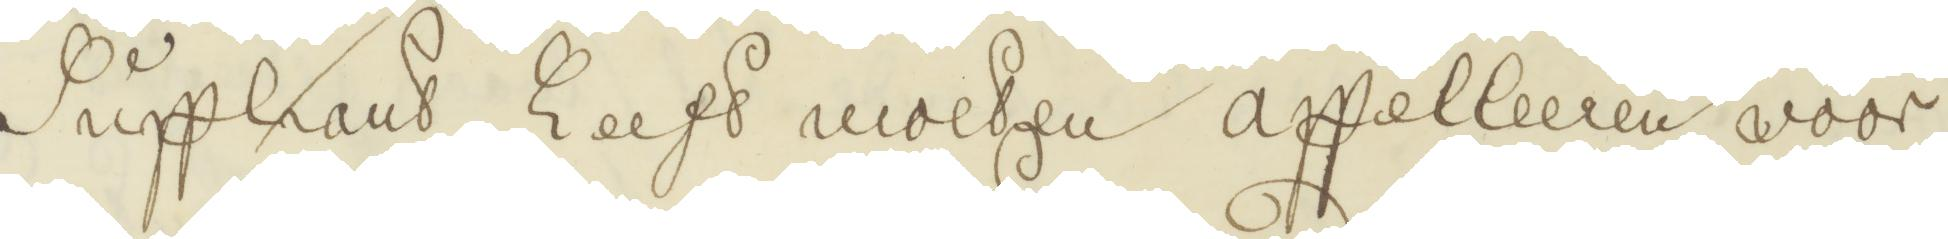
Supplliant heeft moeten appelleeren voor
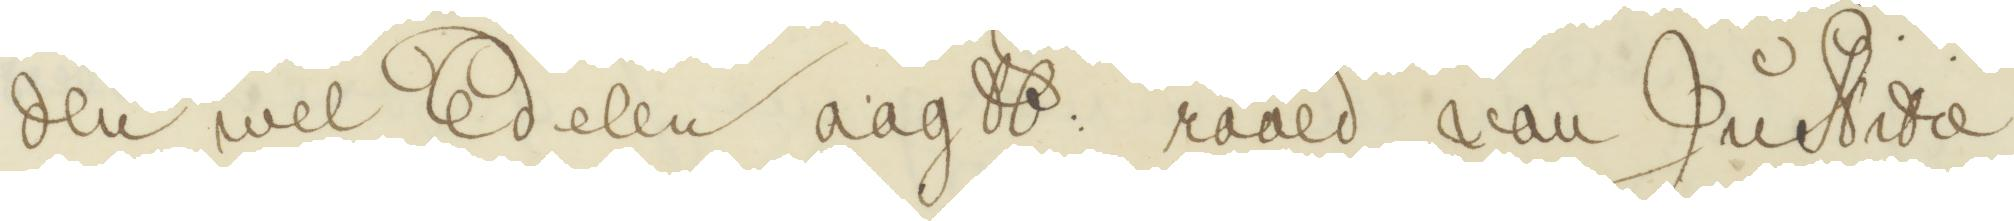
den wel Edelen aagtb: raaed van Justitie
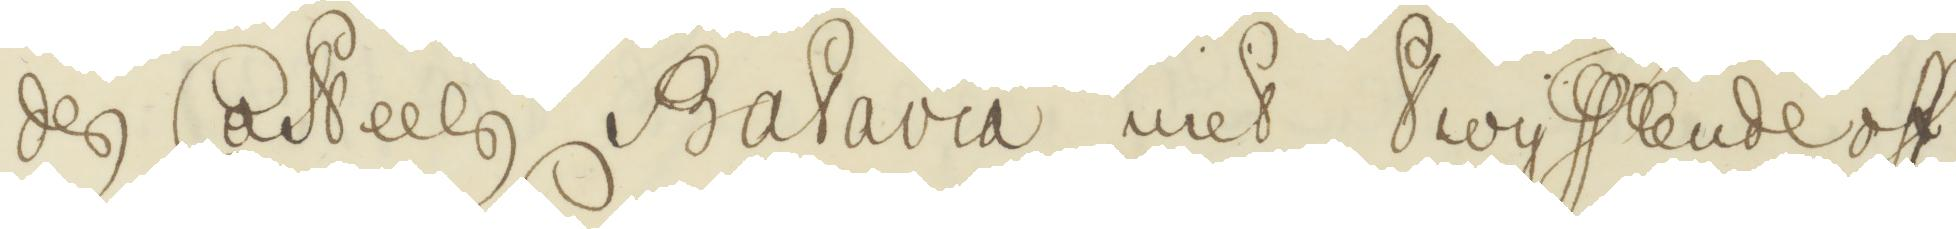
des Casteels Batavia niet twijffelende off
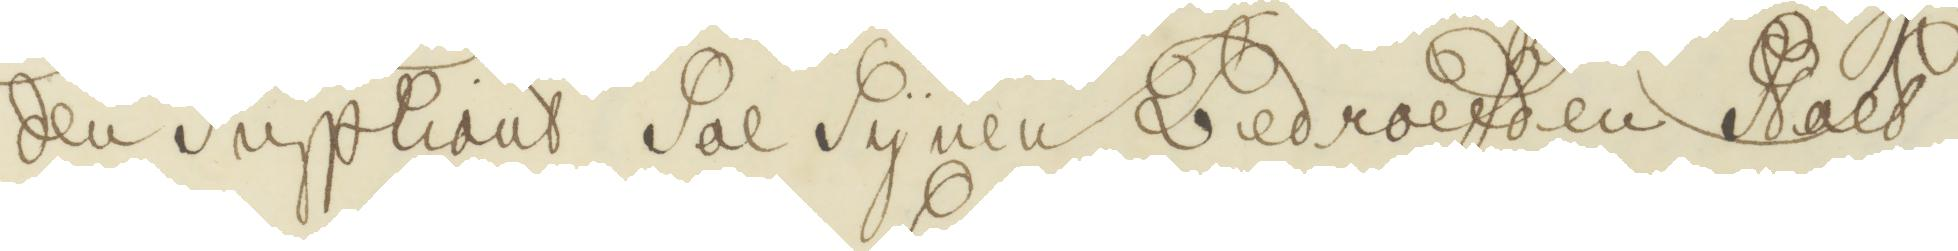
den suppliant sal sijnen bedroefden staet
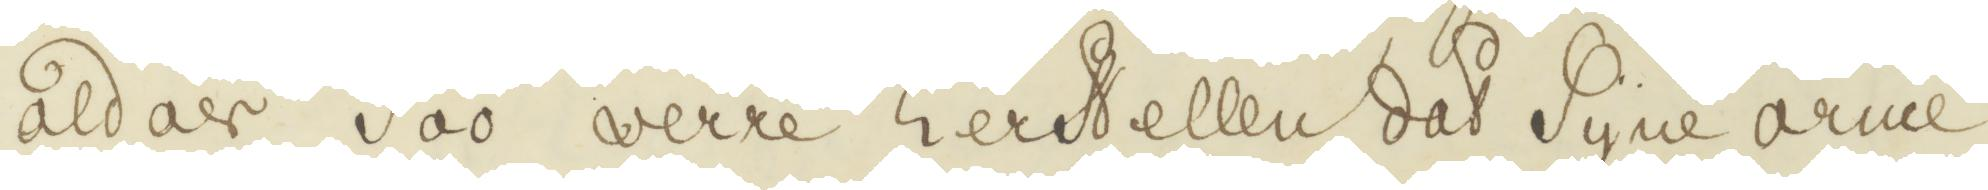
aldaer soo verre herstellen dat sijne arme
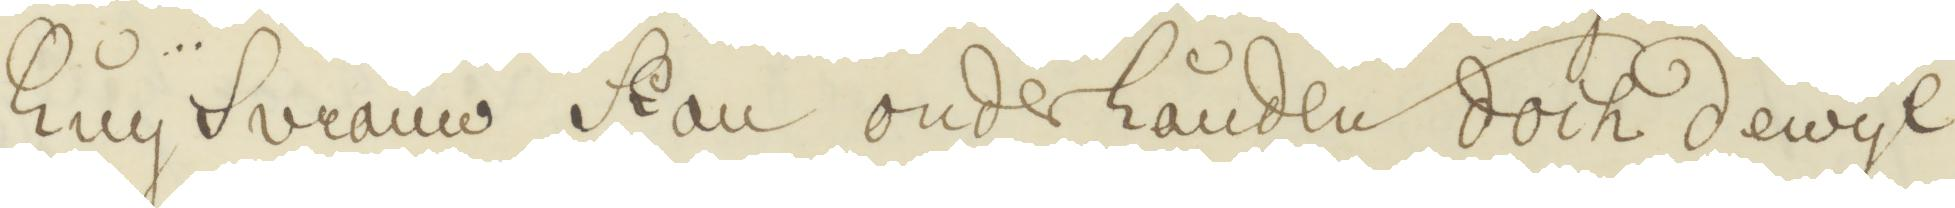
huijsvrouw kan onderhouden doch dewijl
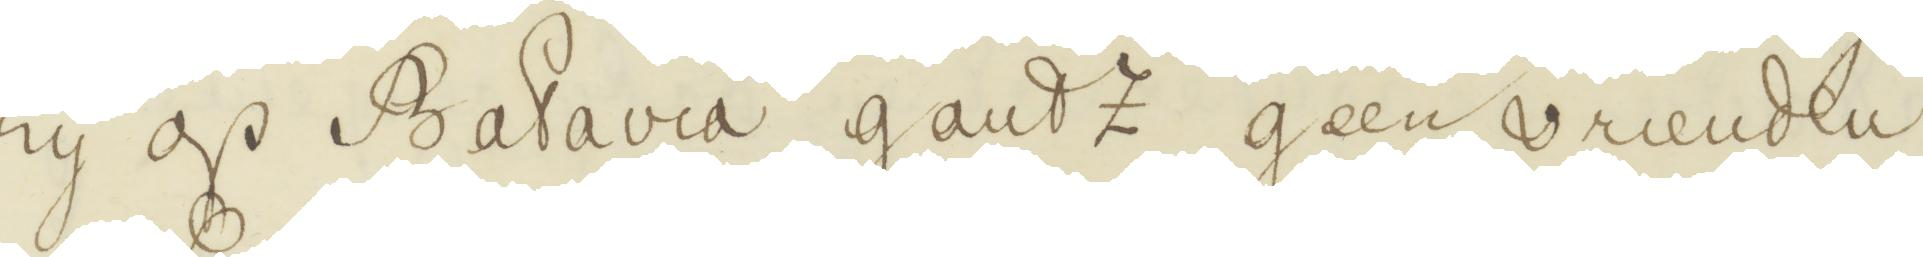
hij op Batavia gandz geen vrienden
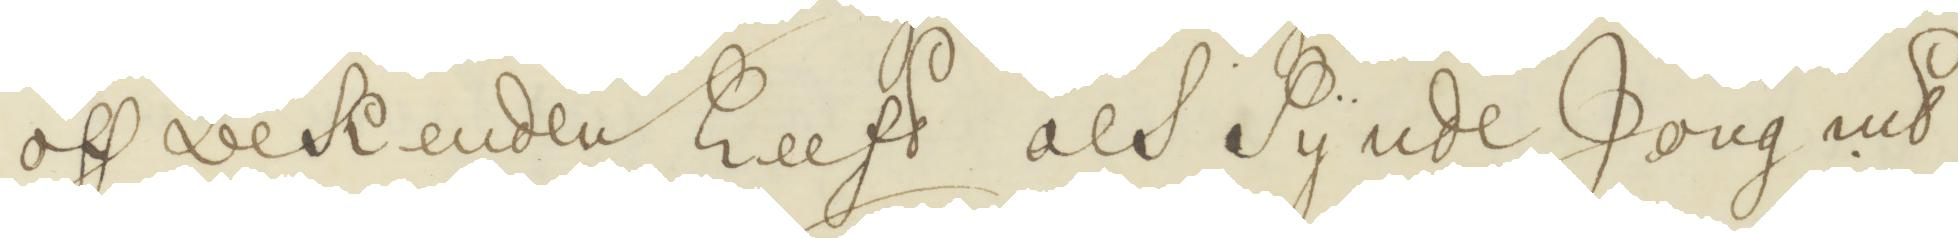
off bekenden heeft als sijnde Jong int
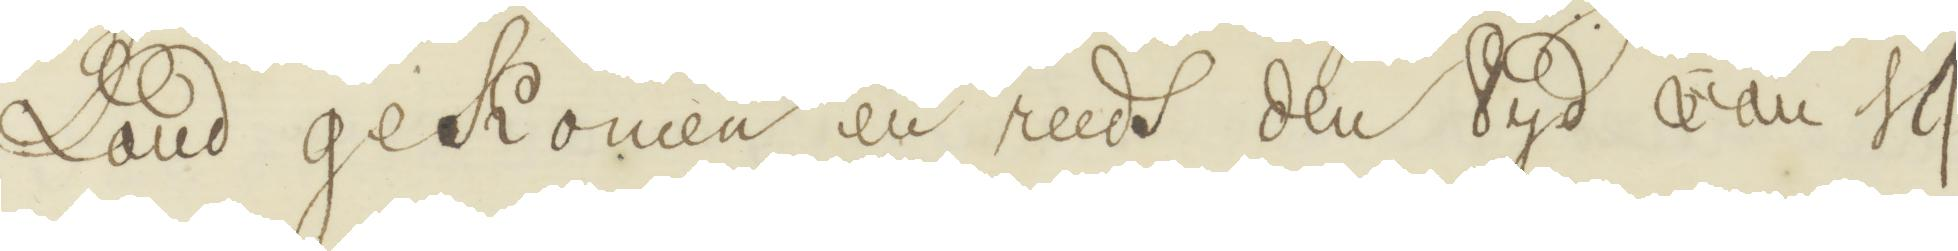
Land gekomen en reeds den tijd van 14
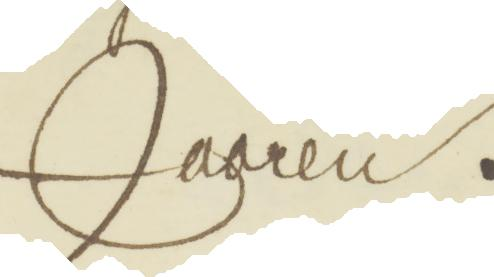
Jaaren
